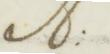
A:
